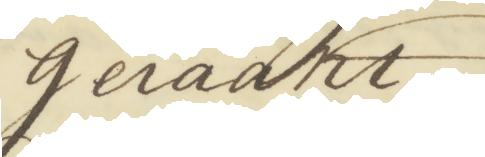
geraakt.
